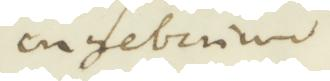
ongebouwd
